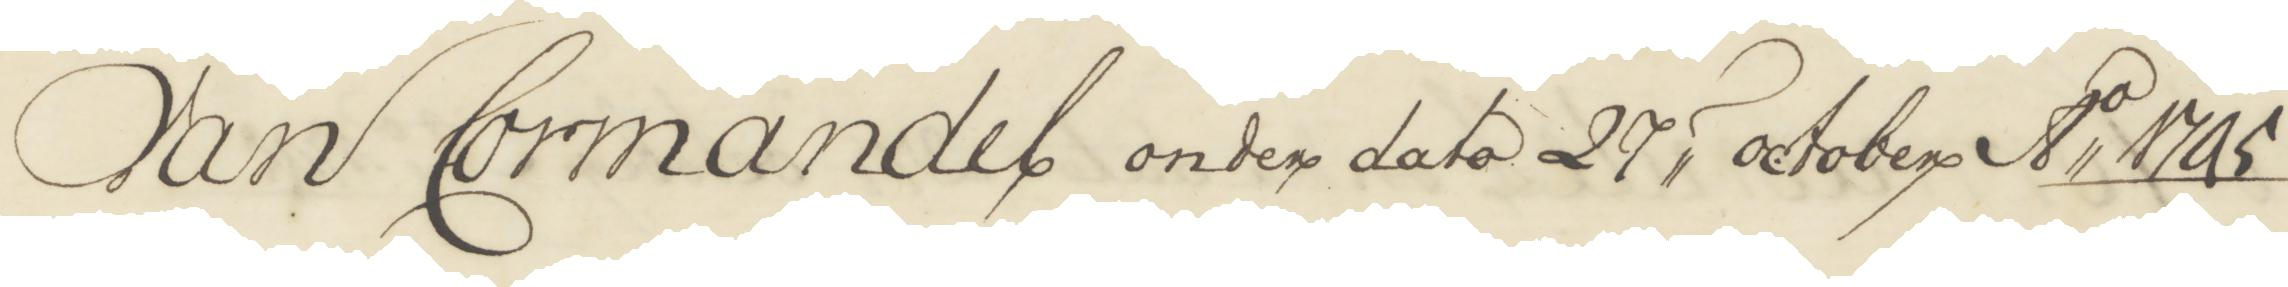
Van Cormandel onder dato 27„' october A„o 1745
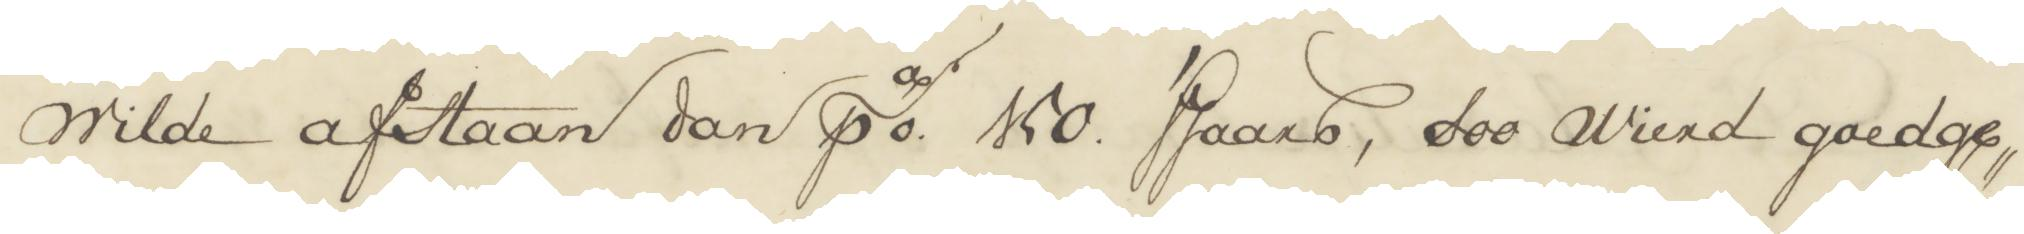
wilde afstaan dan pa/o. 150. 'sJaars, soo wierd goedge„
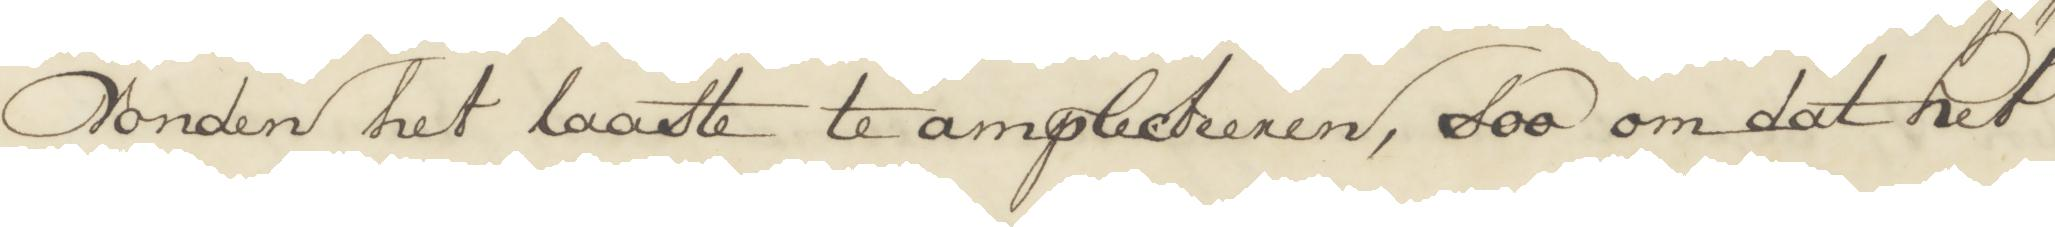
vonden het laaste te amplecteeren, soo om dat het
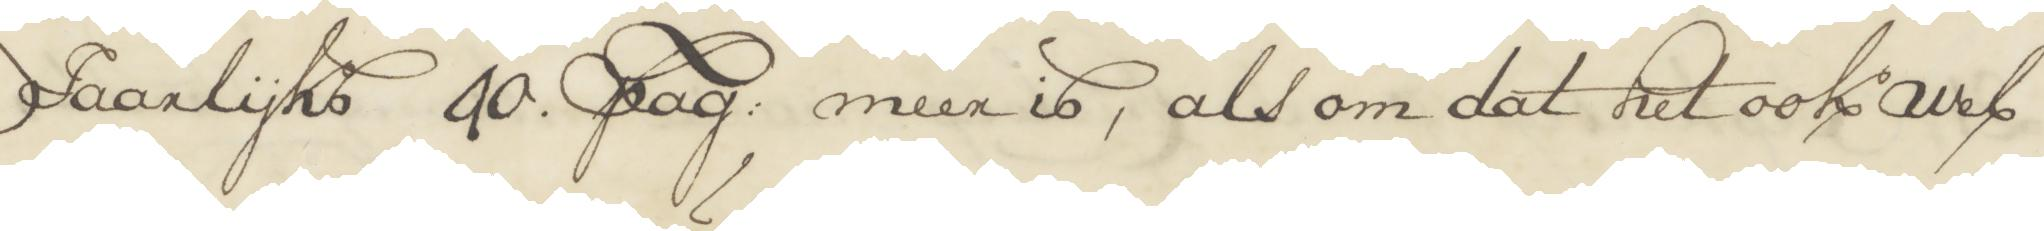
Iaarlijks 40. pag: meer is, als om dat het ook wel
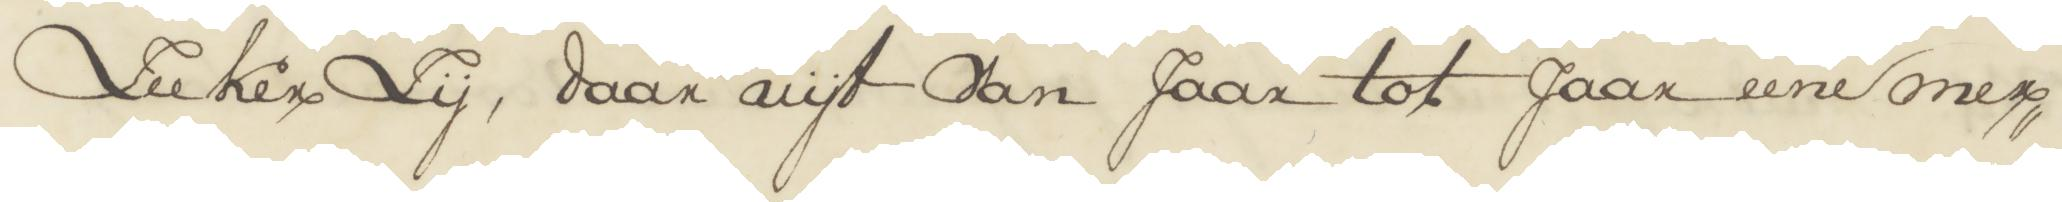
zeeker zij, daar uijt van Jaar tot Jaar eene mer„
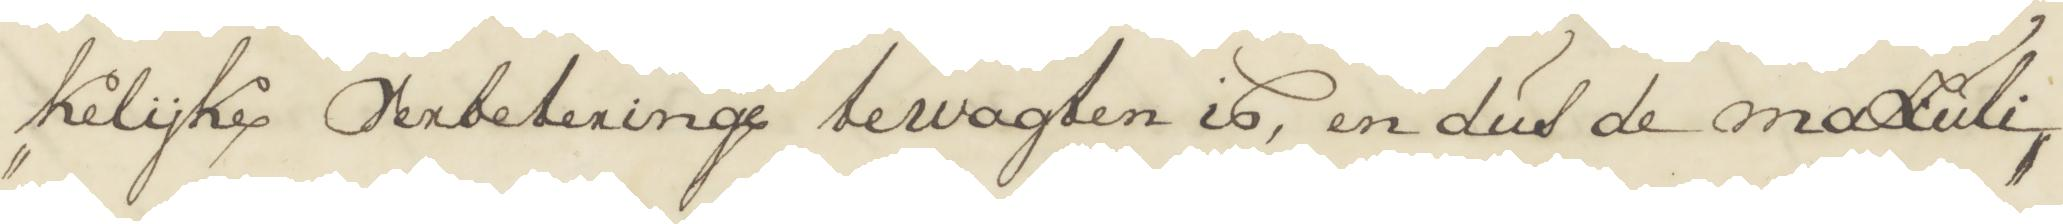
„kelijke verbeteringe tewagten is, en dus de mazuli„
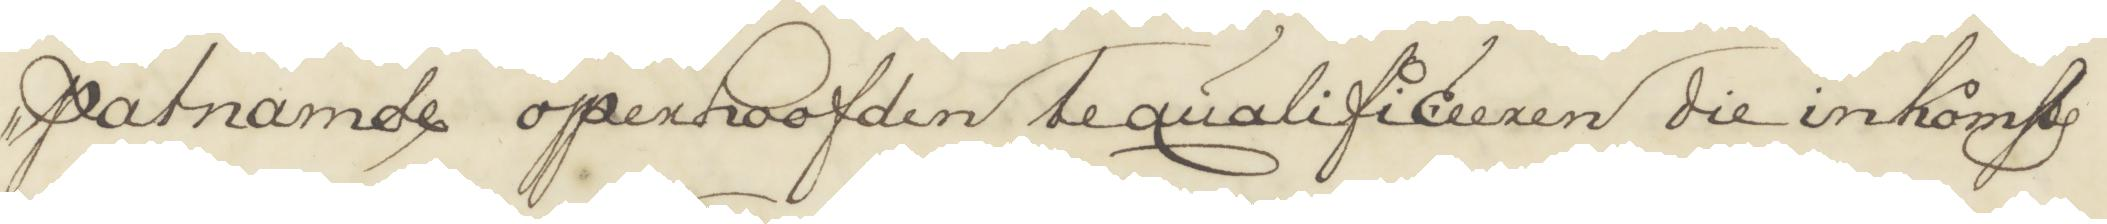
„patnamse opperhoofden te qualificeeren die inkomsten
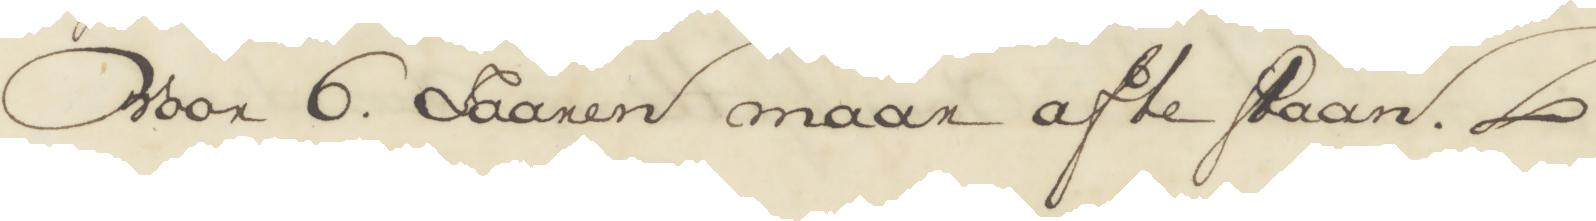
voor 6. Iaaren maar afte staan. —
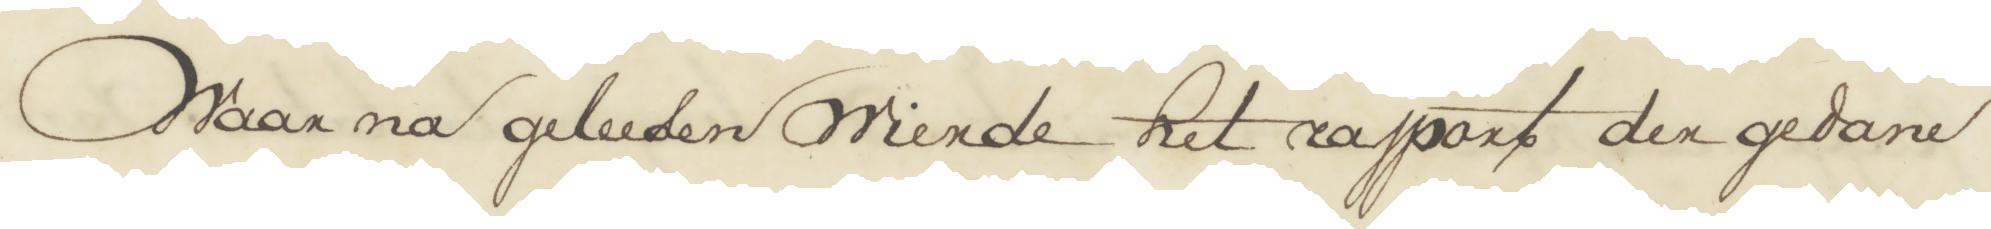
Waar na geleesen wierde het rapport der gedane
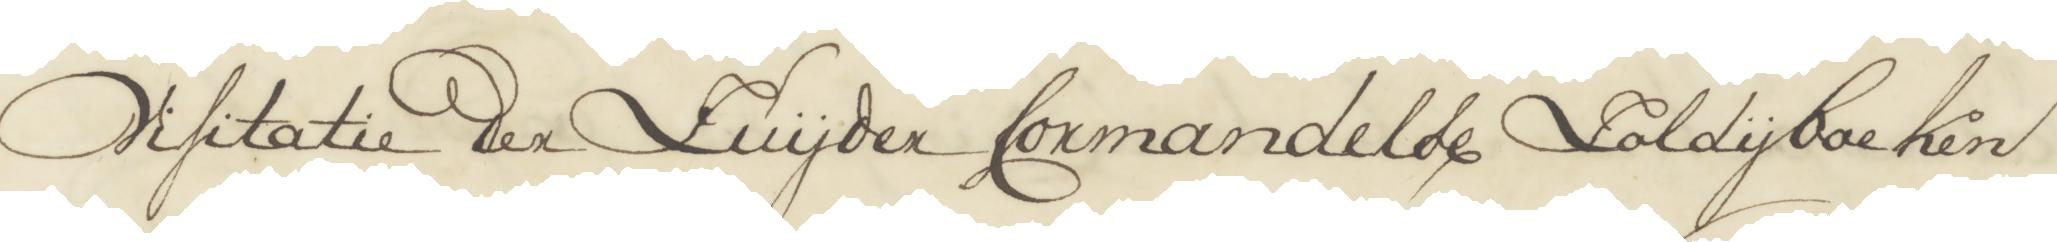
visitatie der zuijder Cormandelse zoldijboeken
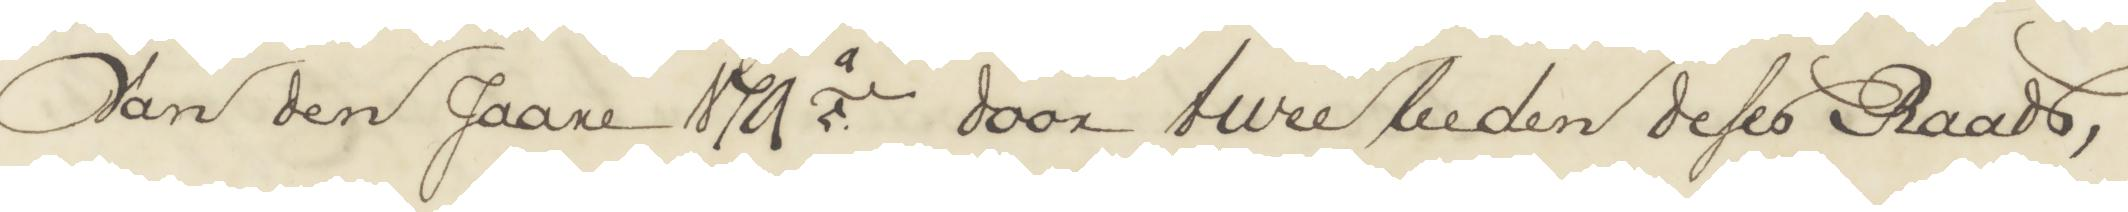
van den Jaare 1744/5. door twee leeden deses Raads,
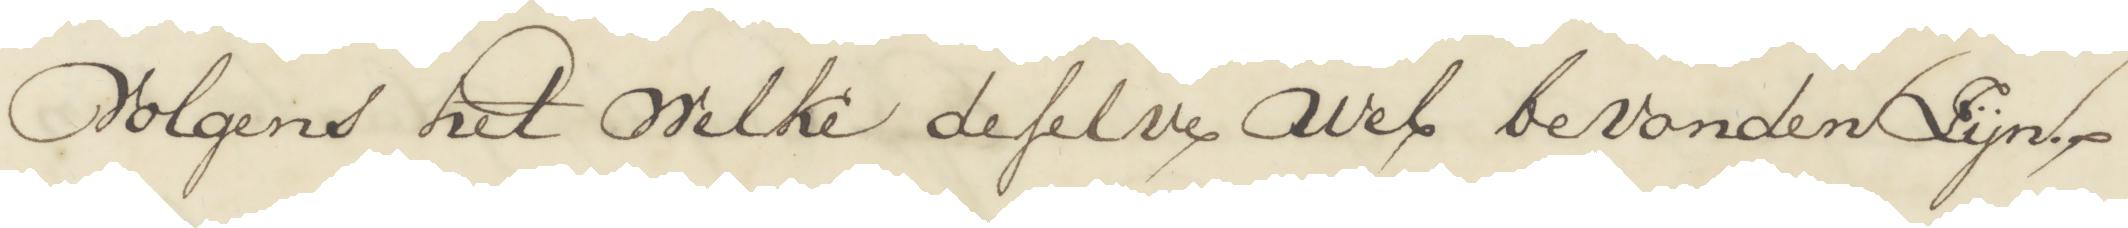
volgens het welke deselve wel bevonden zijn. —
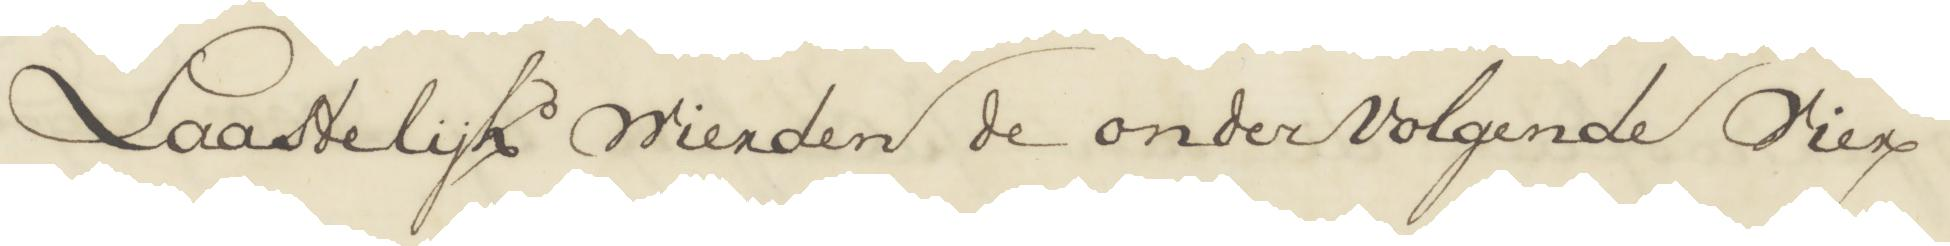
Laastelijk wierden de ondervolgende vier
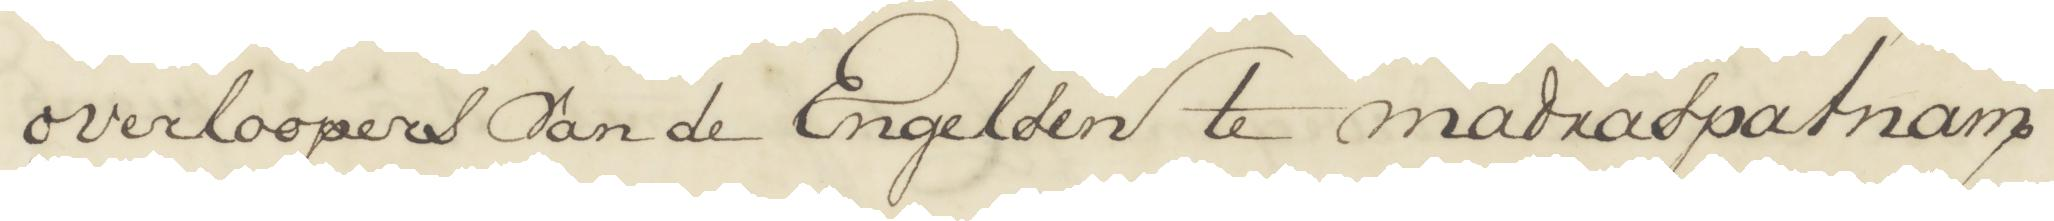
overloopers van de Engelsen te madraspatnam
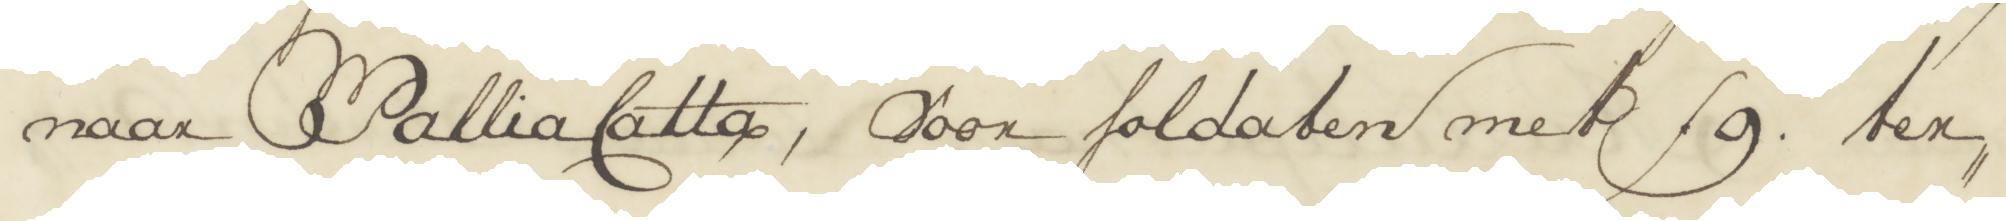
naar Palliacatta, voor soldaten met ƒ 9. ter„
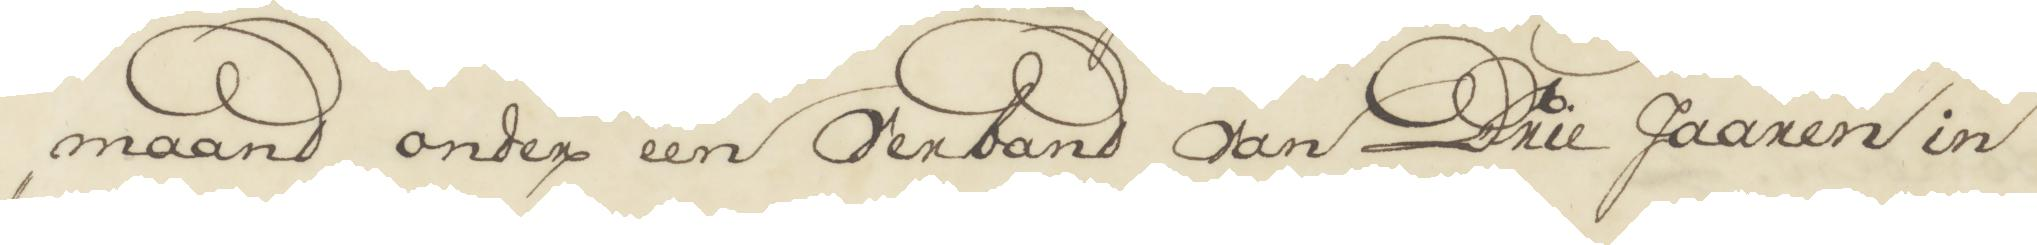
„maand onder een verband van Drie Jaaren in
